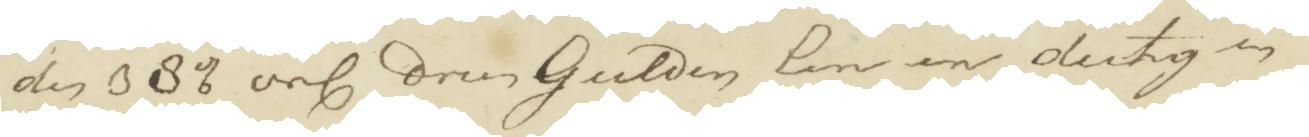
den 387 onC drie Gulden Een en dertig en
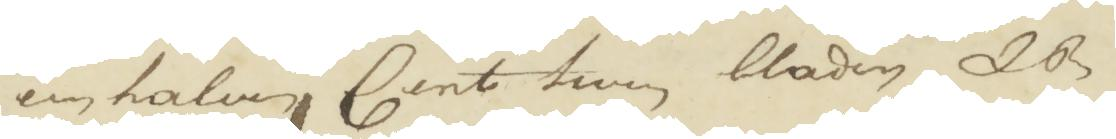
een halven Cent twee bladen ZR
